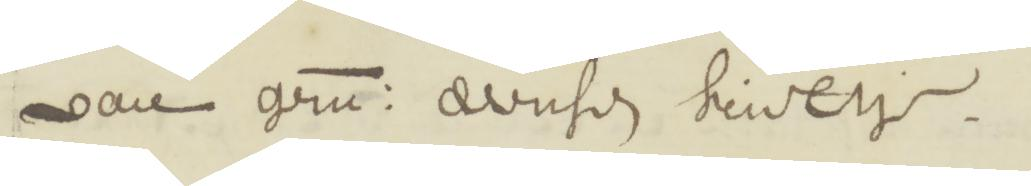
van gem: deensen kieltje –
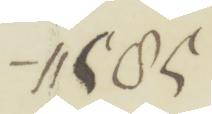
–„585
